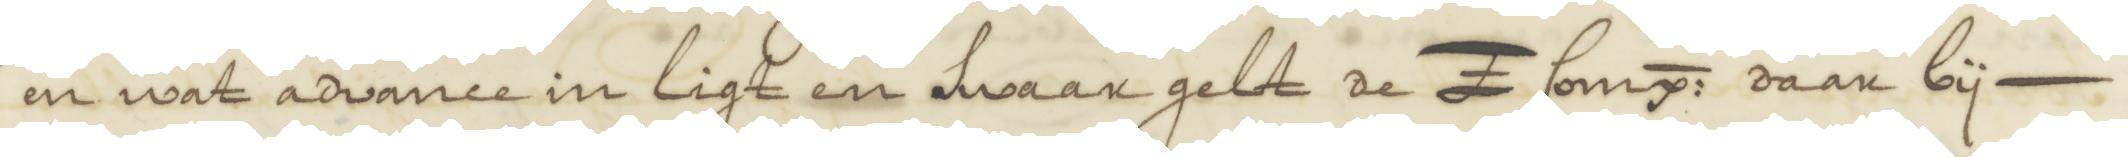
en wat advance in ligt en swaar gelt de E Comp: daar bij —
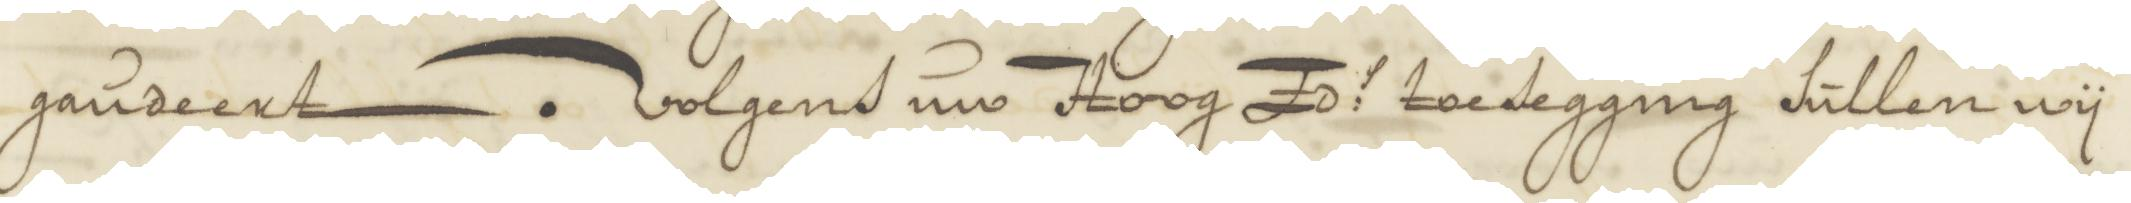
gaudeert. Volgens uw Hoog Ed:s toesegging sullen wij
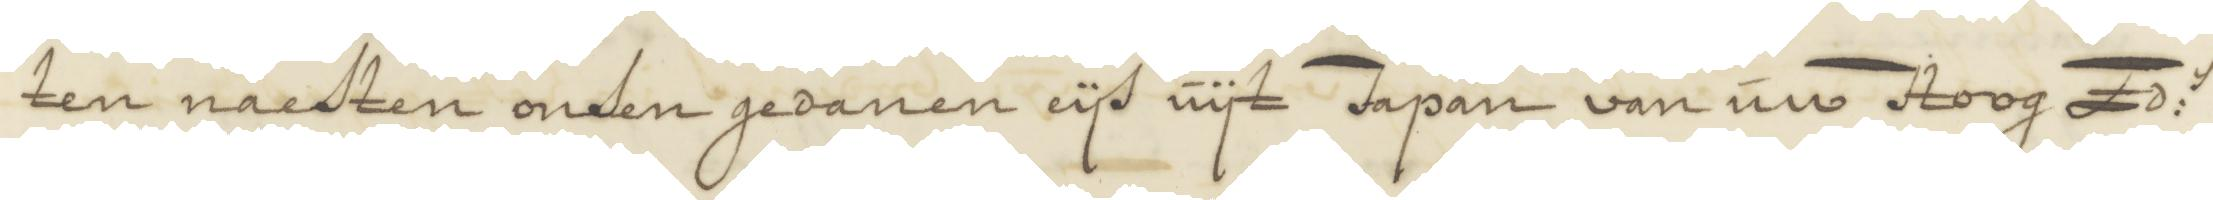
ten naesten onsen gedanen eijs uijt Iapan van uw Hoog Ed:s
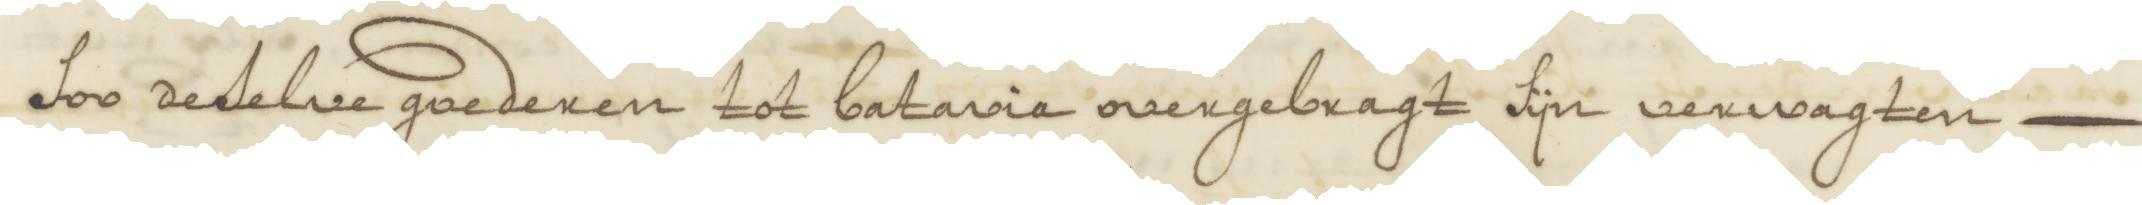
soo deselve goederen tot batavia overgebragt sijn verwagten —
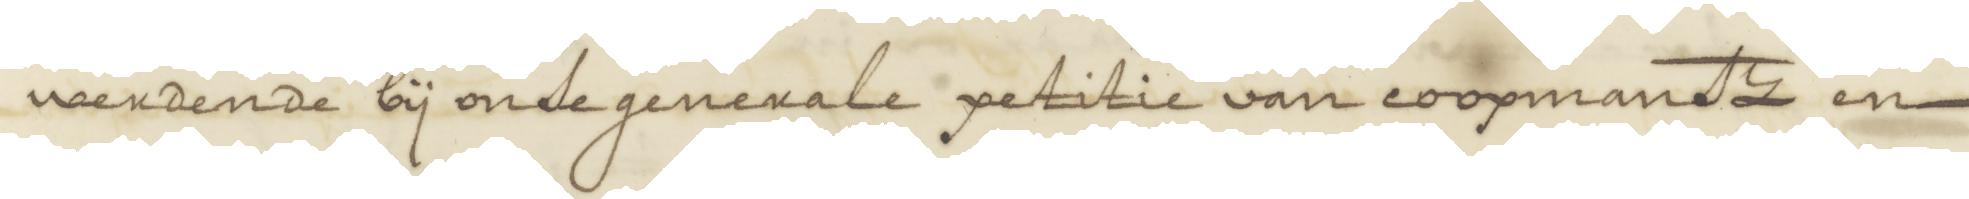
werdende bij onse generale petitie van coopmansz en
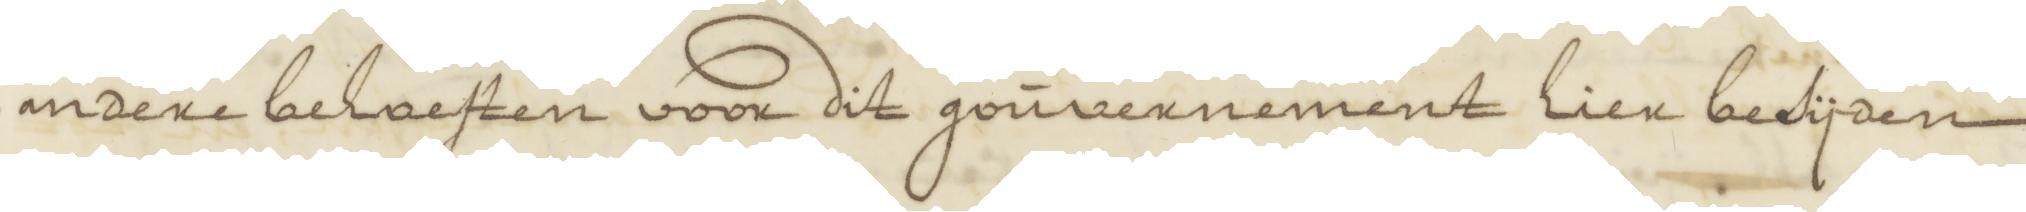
andere behoeften voor dit gouvernement hier besijden
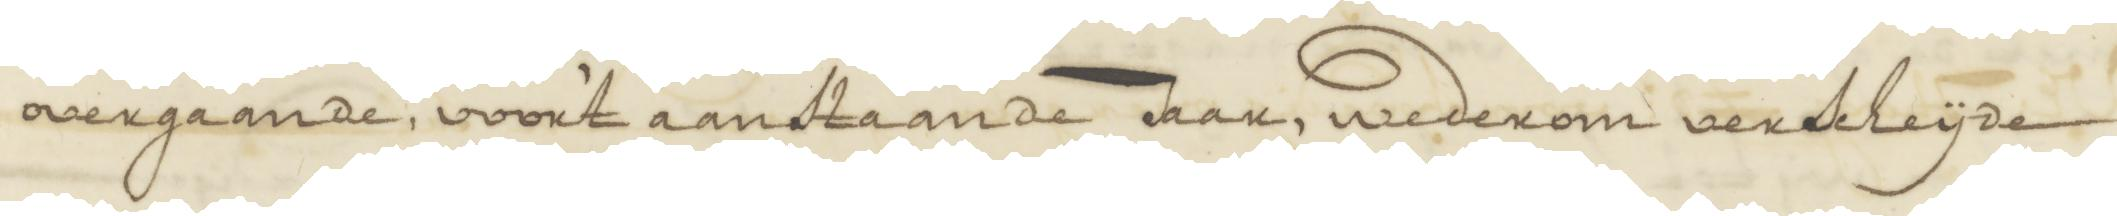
overgaande, voor’t aanstaande Iaar, wederom verscheijde
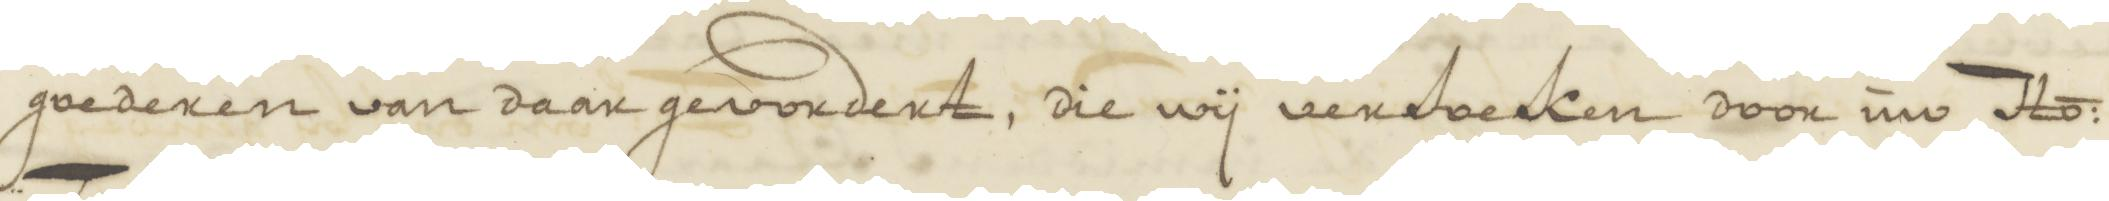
goederen van daar gevordert, die wij versoeken door uw Ho:
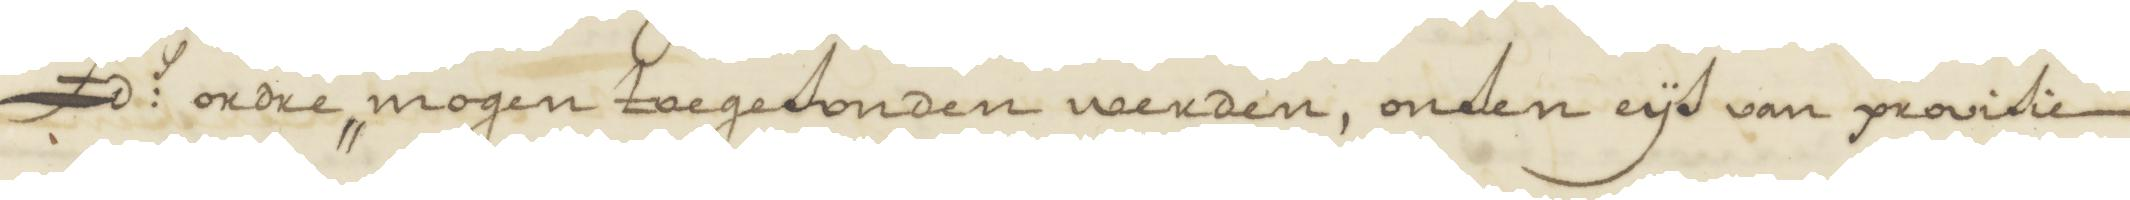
Ed:s ordre „ mogen toegesonden werden, onsen eijs van provisie
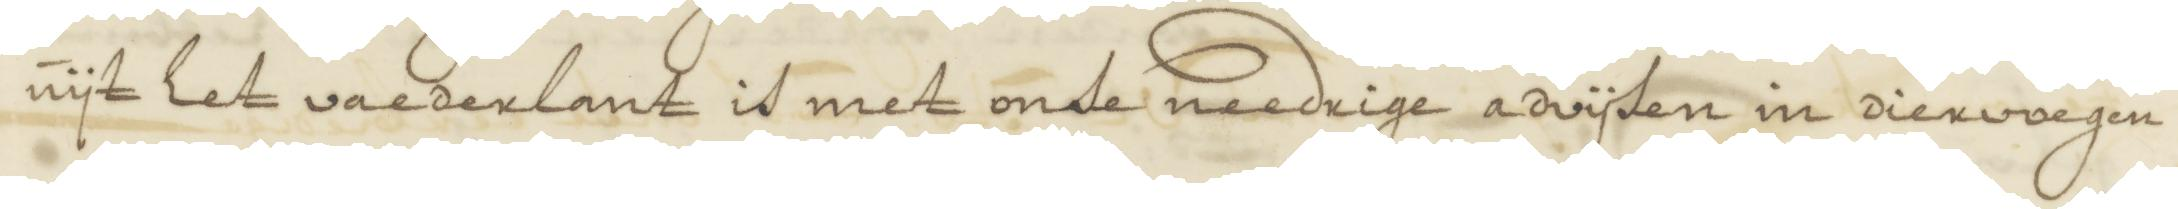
uijt het vaederlant is met onse needrige advijsen in diervoegen
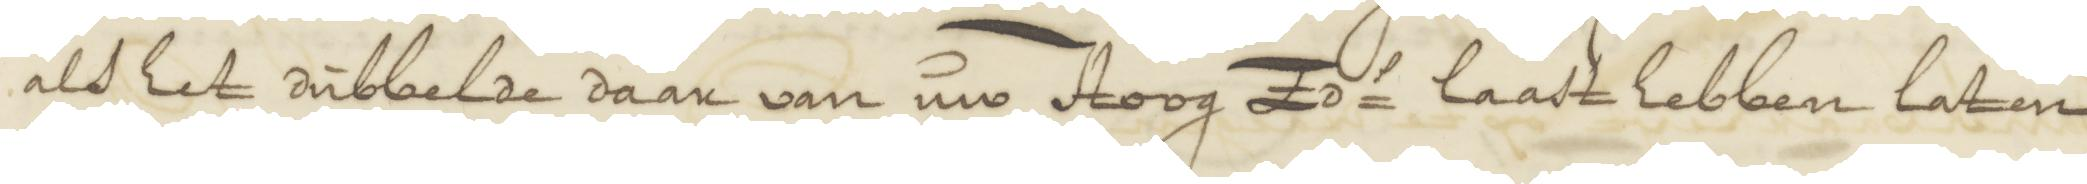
als het dubbelde daar van uw Hoog Ed=s laast hebben laten
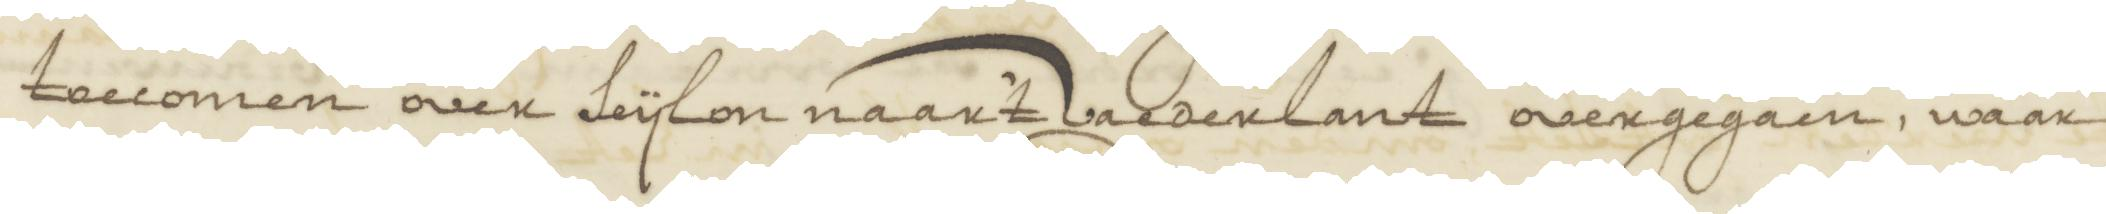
toecomen over seijlon naar ’t vaederlant overgegaen, waar
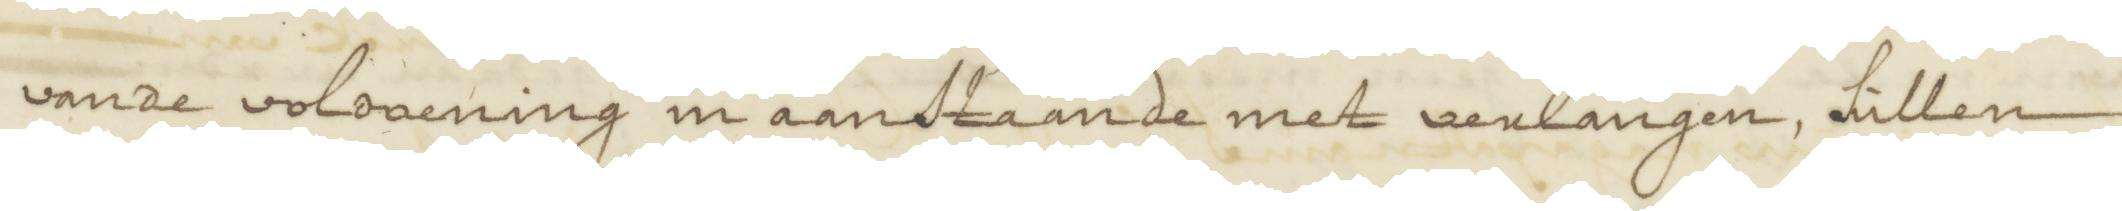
vande voldoening in aanstaande met verlangen, sullen
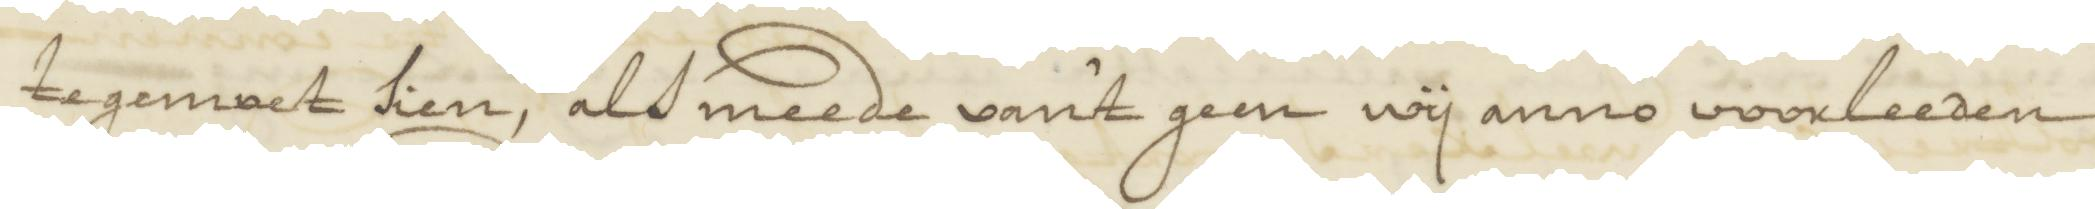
tegemoet sien, als meede van ’t geen wij anno voorleeden
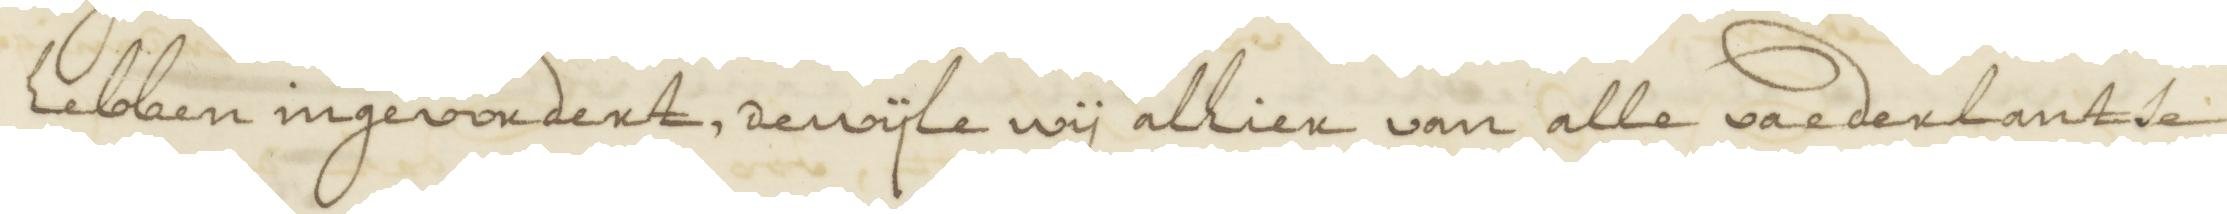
hebben ingevordert, dewijle wij alhier van alle vaederlantse
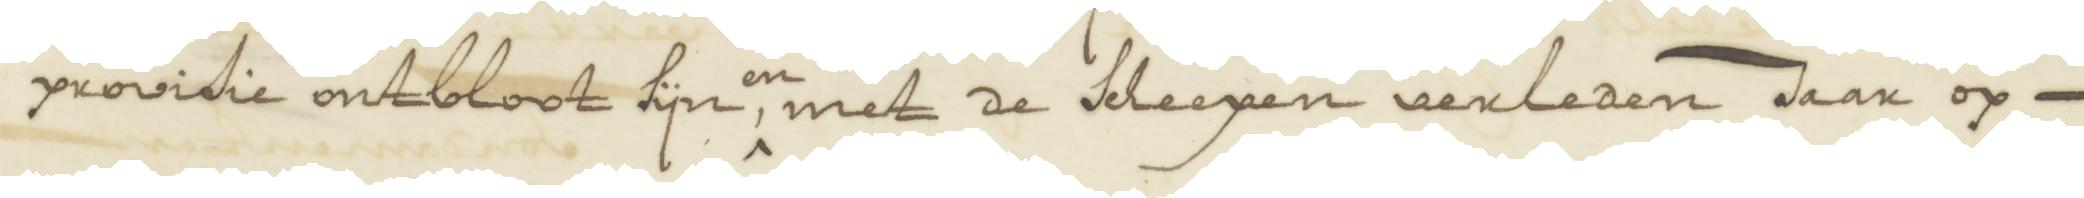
provisie ontbloot sijn, met de scheepen verleden Iaar op —
